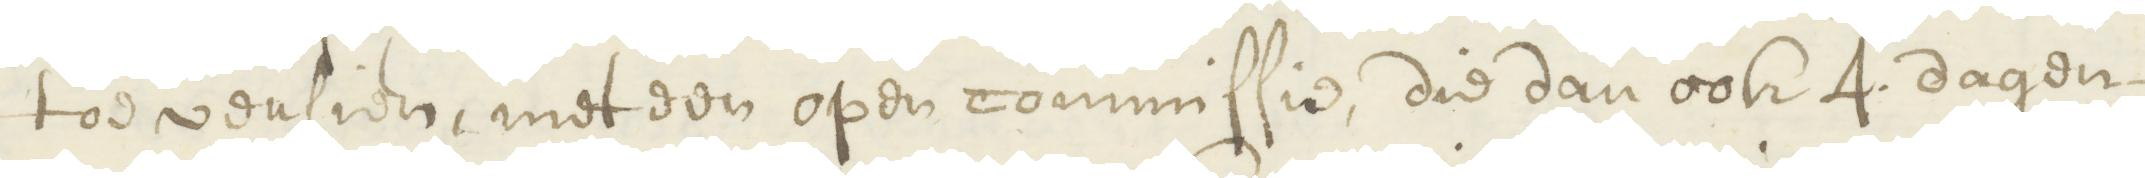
toe versien, met een open commissie, die dan ook 4. dagen
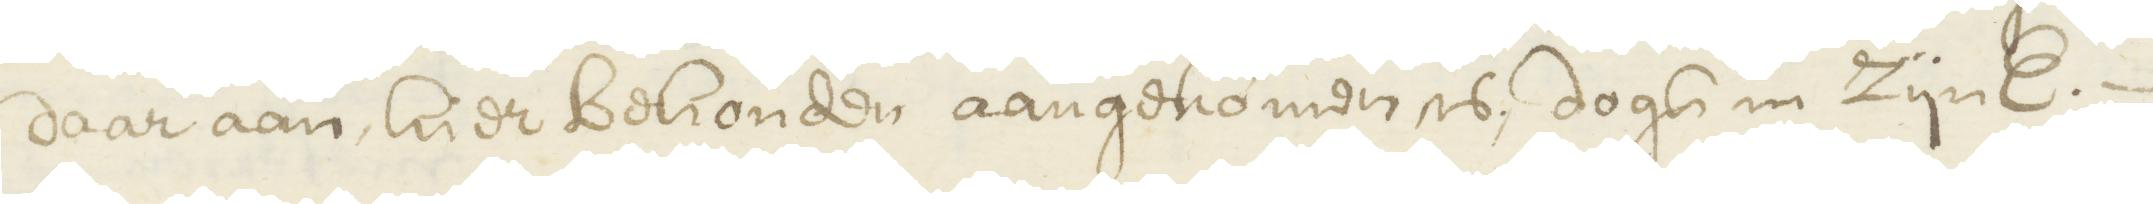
daar aan, hier behouden aangekomen is, dogh in zijn E.-
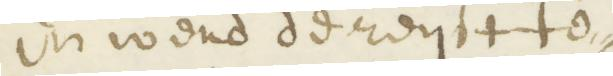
en werd de reijst te„
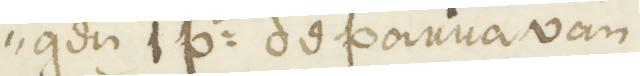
„gen 1 p=a de parra van
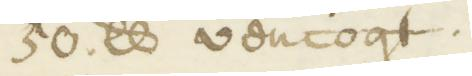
50. lb vercogt.
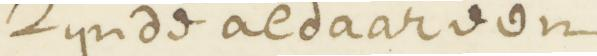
zijnde aldaar een
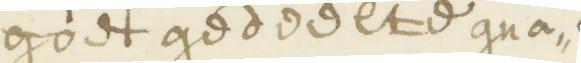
goet gedeelte gra„
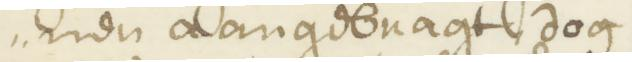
„nen aangebragt dog
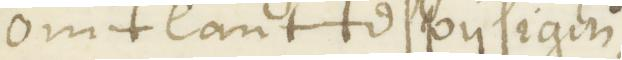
om ’t lant te spijsigen
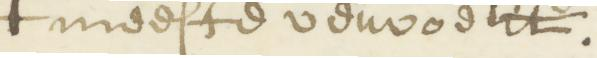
't meeste vervoert.
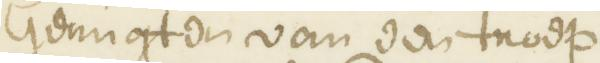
gerugten van een troep
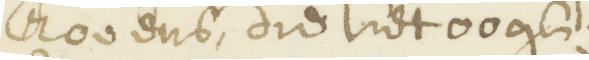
rovers, die het oogh
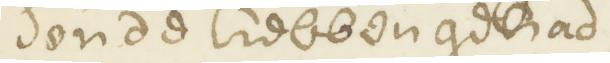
soude hebben gehad
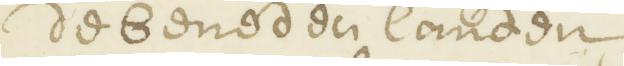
de beneden landen
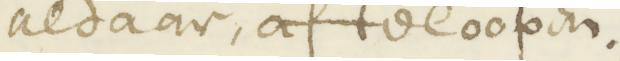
aldaar, af te loopen.
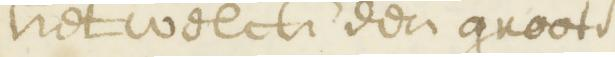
het welck een groot
